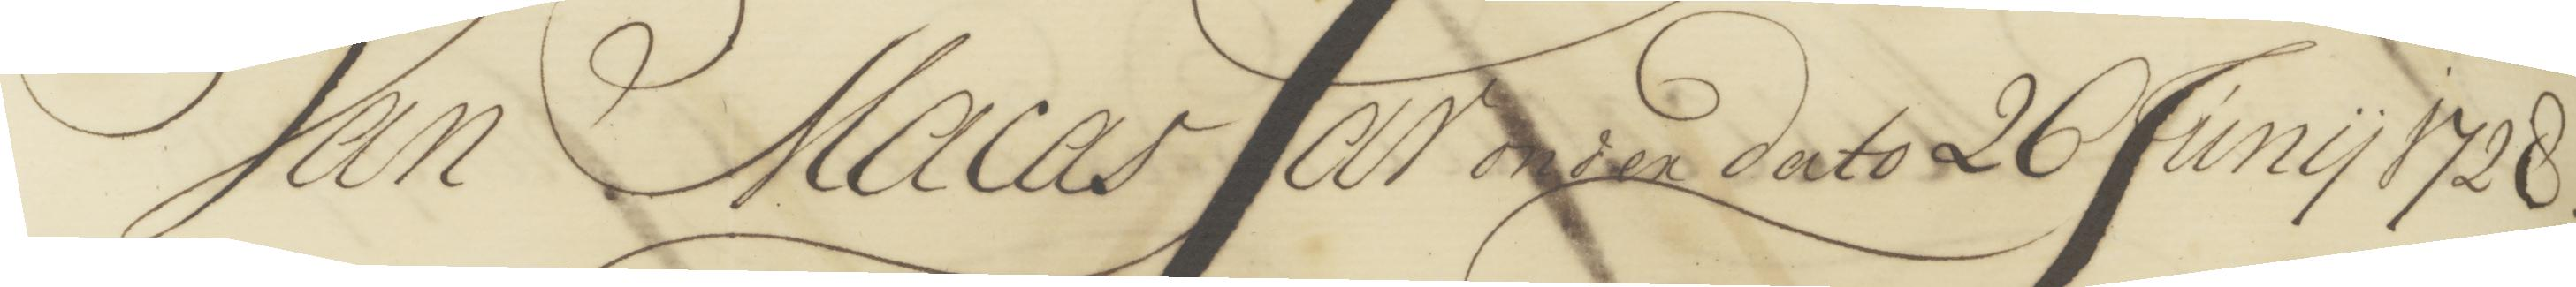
Van Macassar onder dato 26 Junij 1728
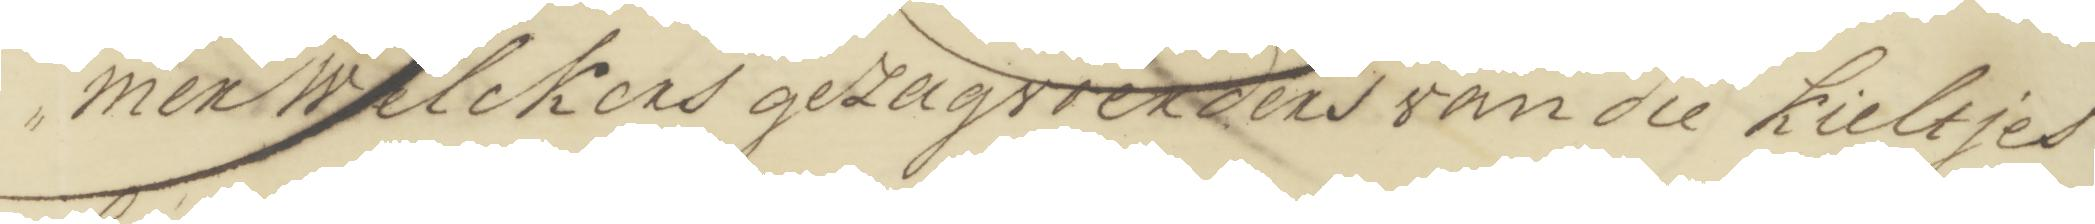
„mer welckers gezagtvoerders van die kieltjes
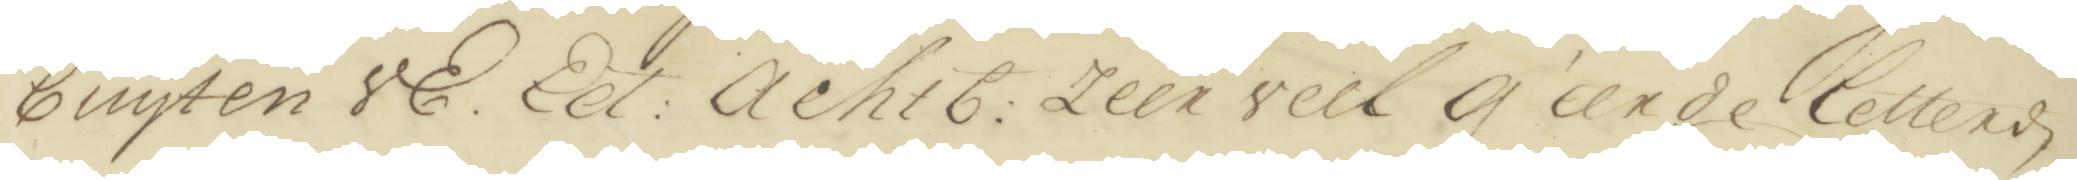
buijten VE. Ed: Achtb: zeer veel g’eerde letteren
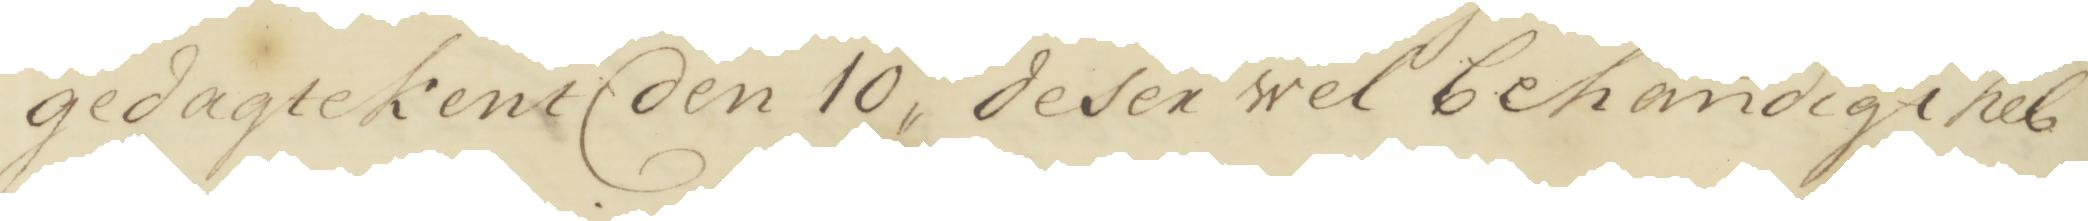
gedagtekent den 10„e deser wel behandigt heb
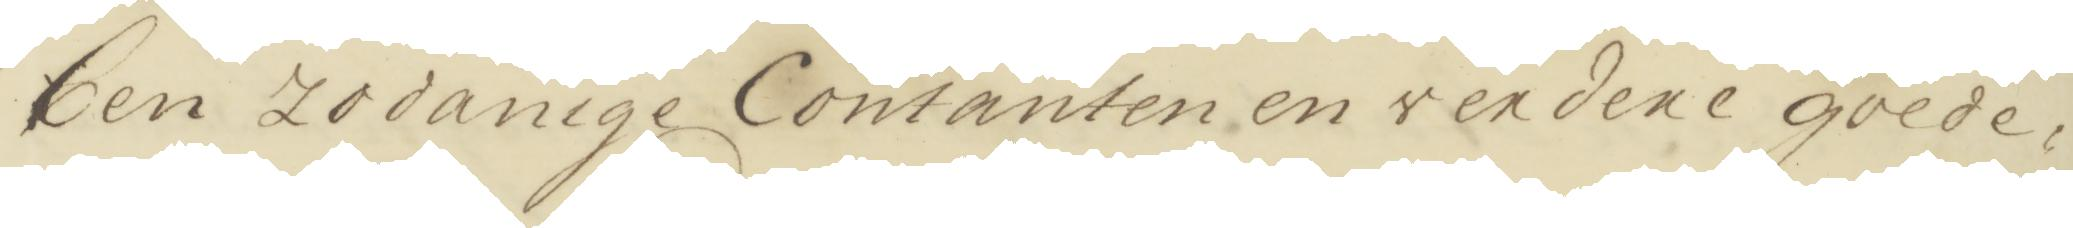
ben zodanige Contanten en verdere goede„
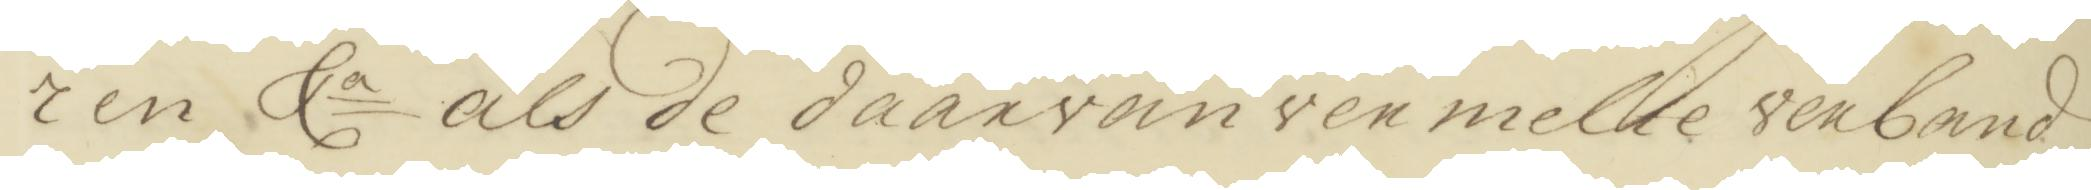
ren &=a als de daarvan vermelde verband
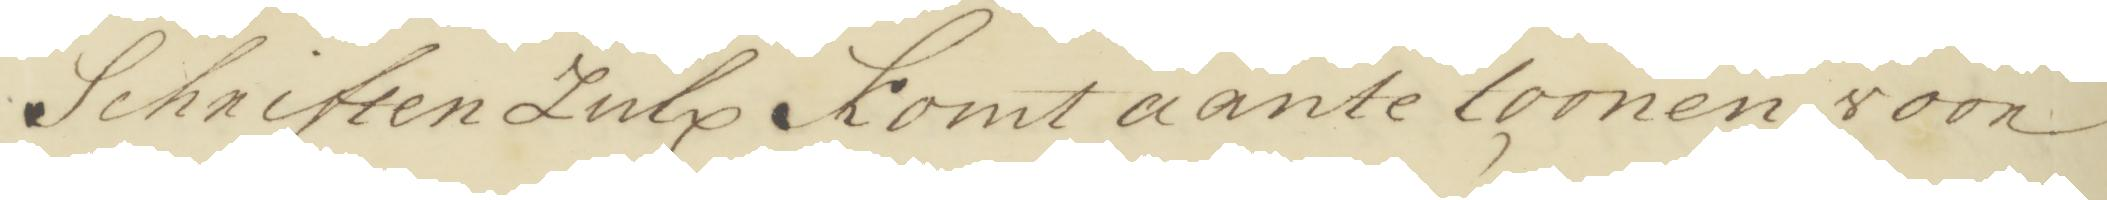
schriften zulx komt aan te toonen, voor
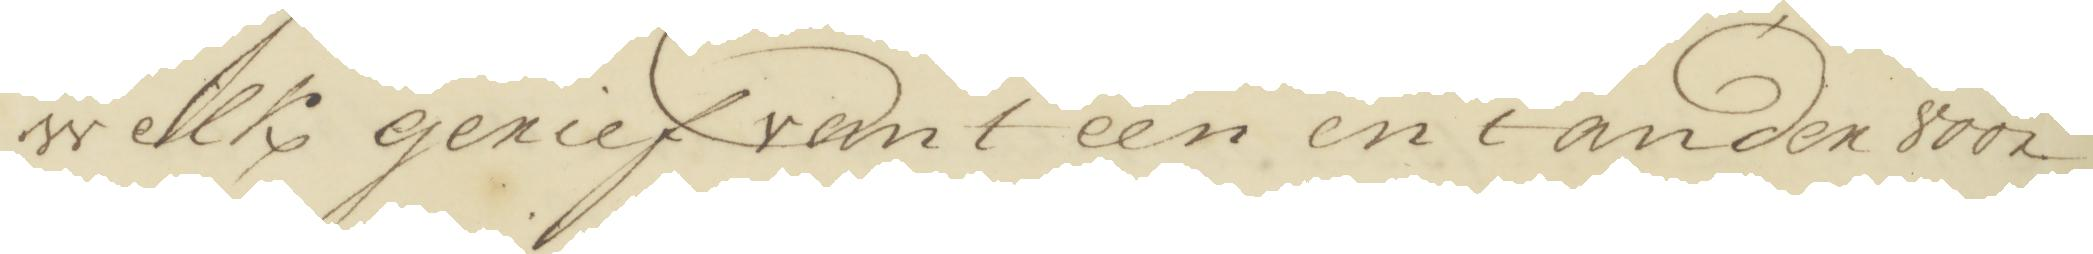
welk gerief van t' een en 't ander voor
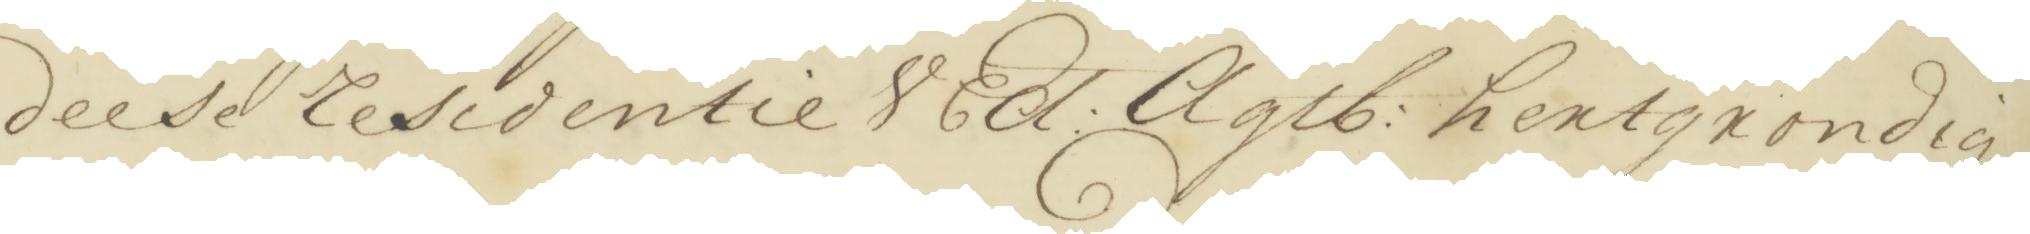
deese residentie VEd: Agtb: hertgrondig
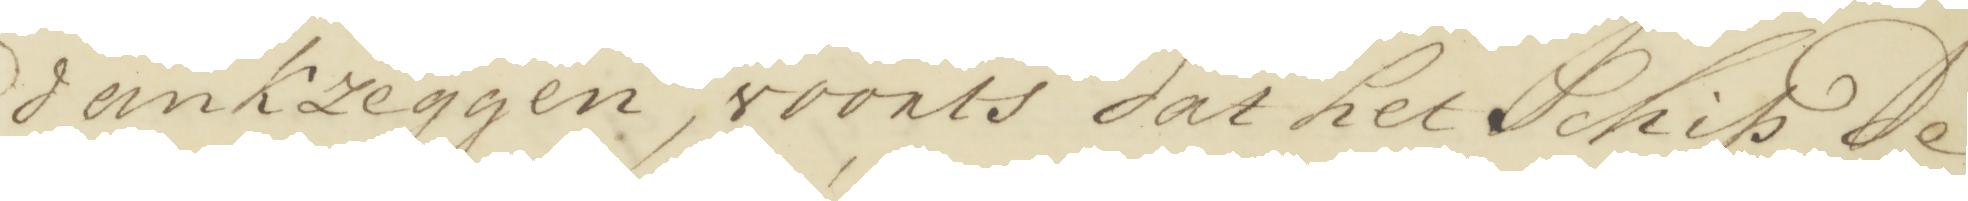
dankzeggen, voorts dat het schip de
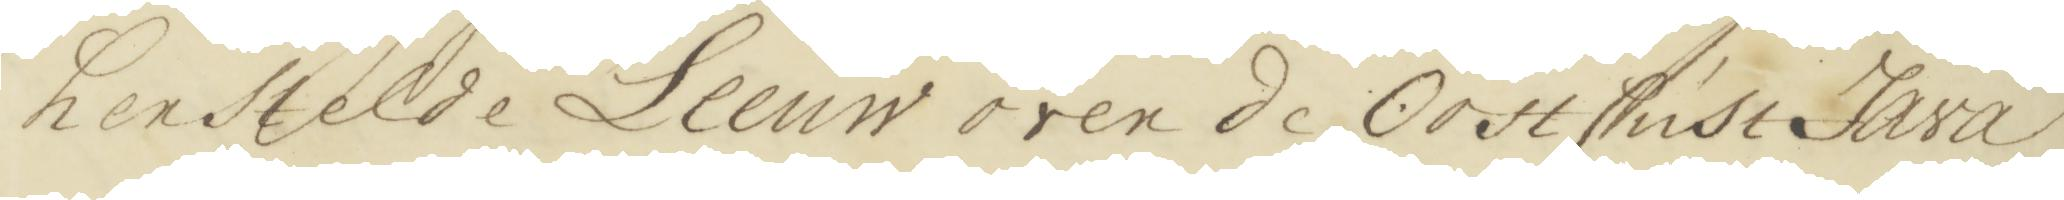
herstelde Leeuw over de Oost Cust Iava
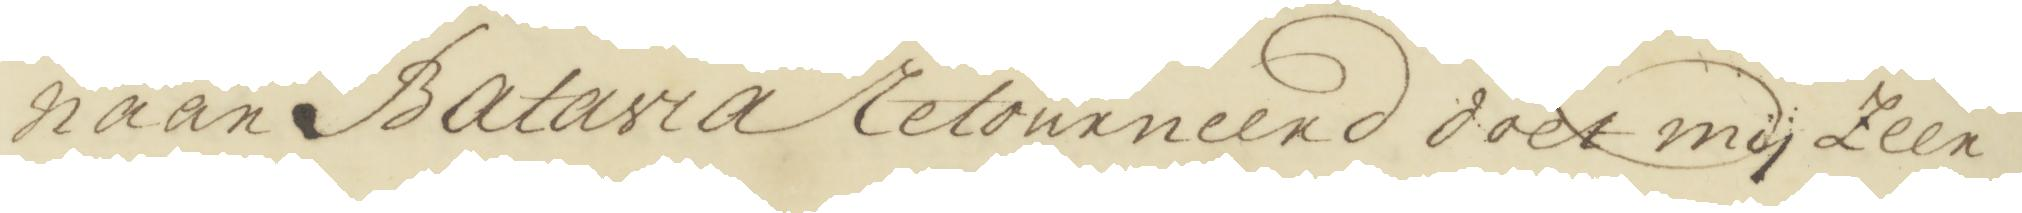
naar Batavia retourneerd doet mij zeer
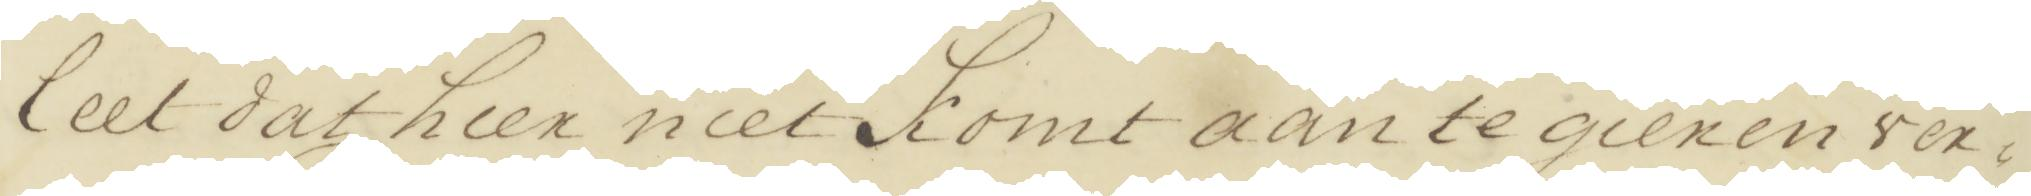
leet dat hier niet komt aan te gieren ver„
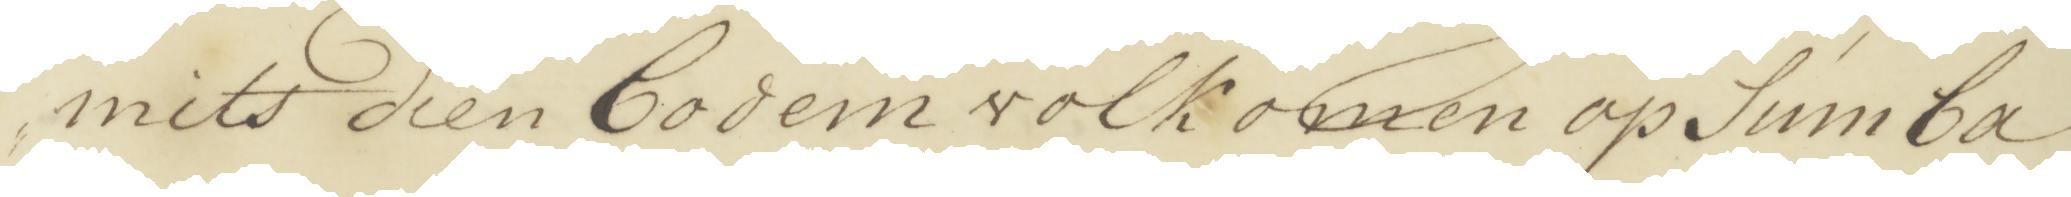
„mits dien bodem volkomen op sumba
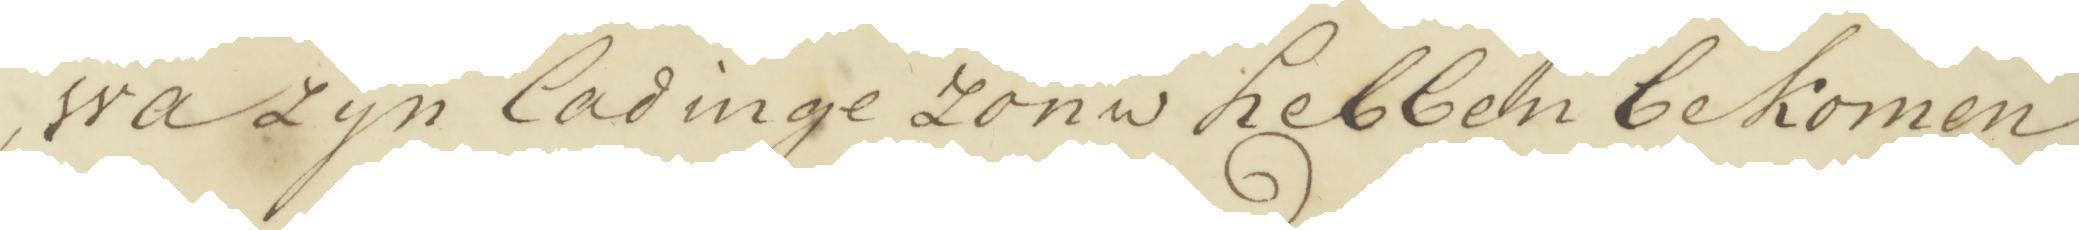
,wa zijn ladinge zouw hebben bekomen
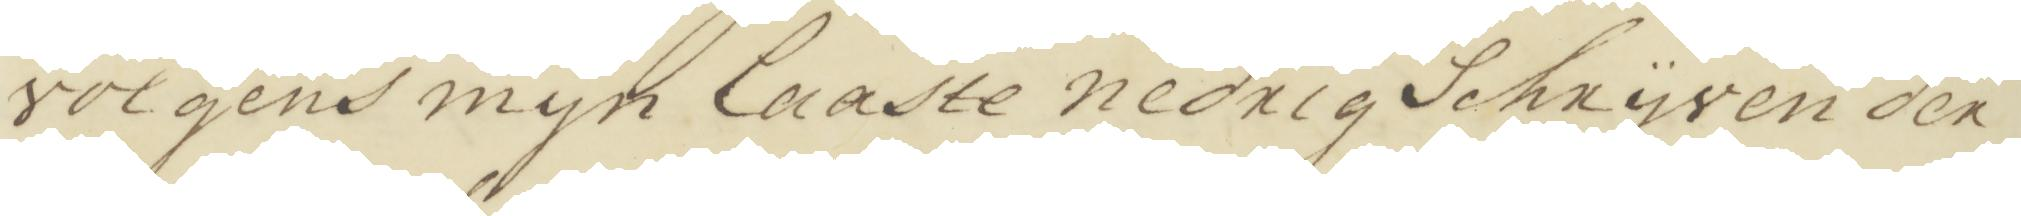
volgens mijn laaste nedrig schrijven der
